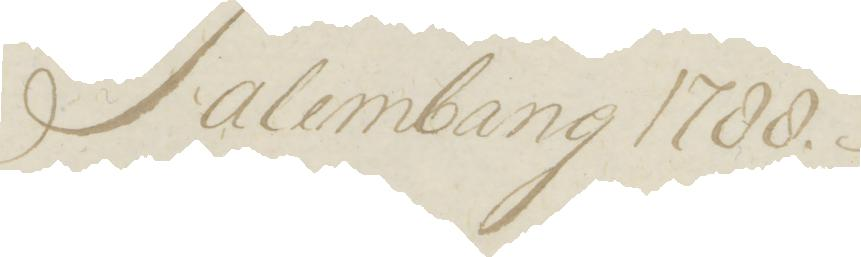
Palembang 1788.
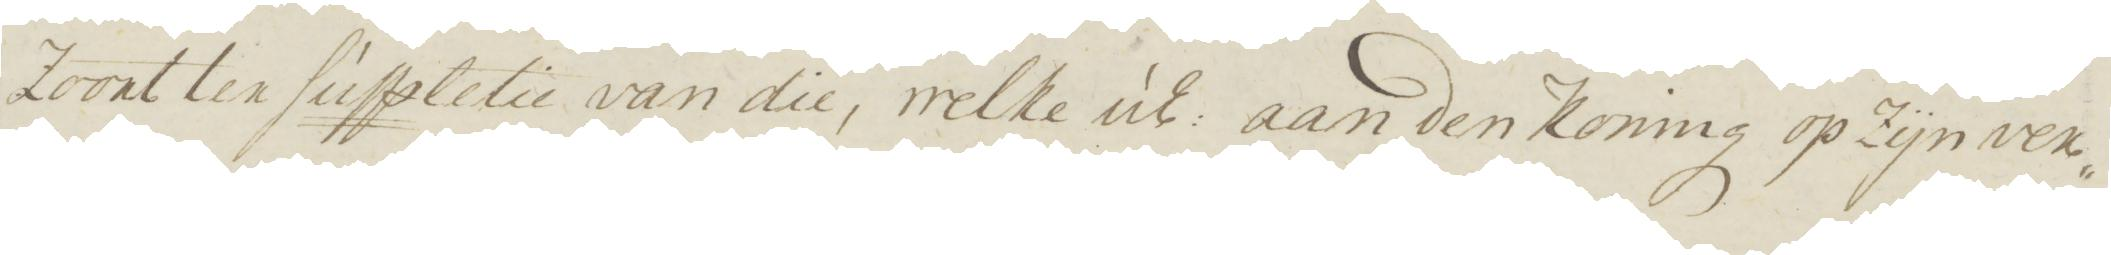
zoort ter suppletie van die, welke uE: aan den Koning op Zijn ver„
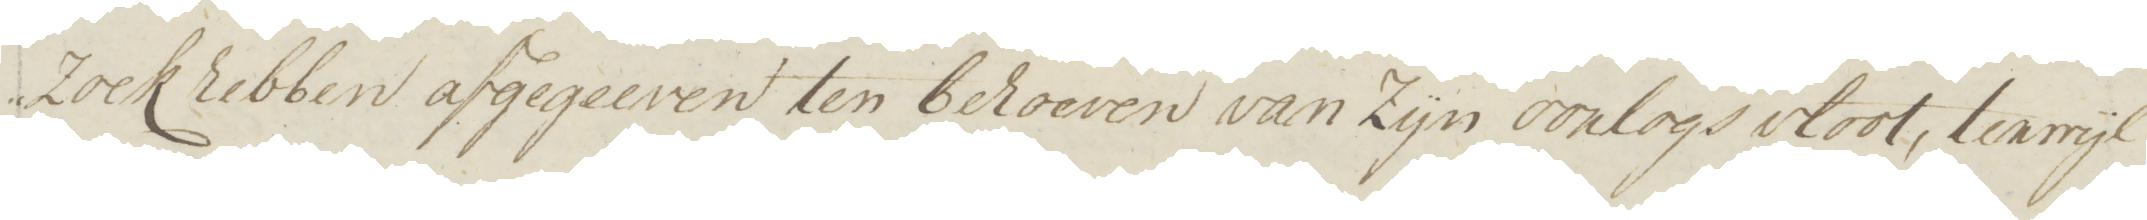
„zoek hebben afgegeeven ten behoeven van Zijn oorlogs vloot, terwijl
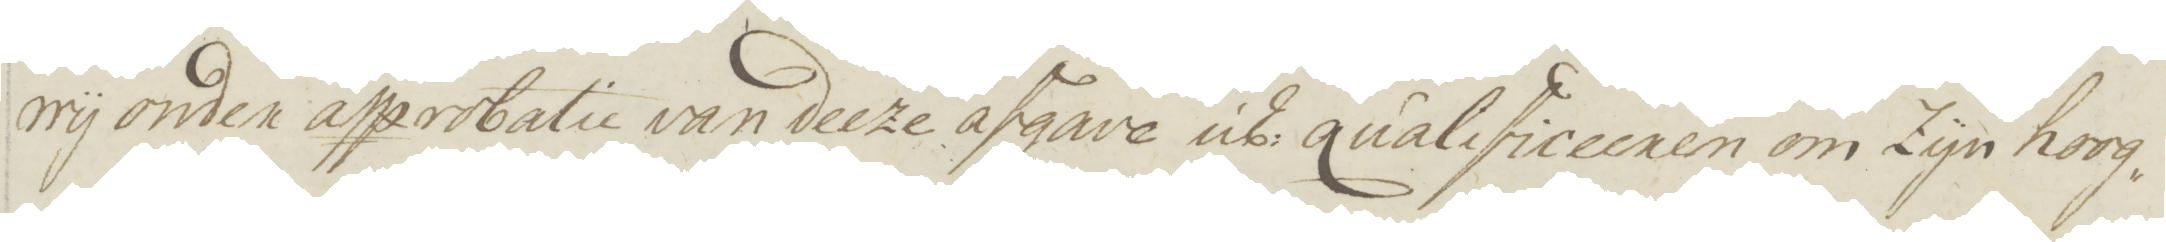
wij onder approbatie van deeze afgave uE: qualificeeren om Zijn hoog„
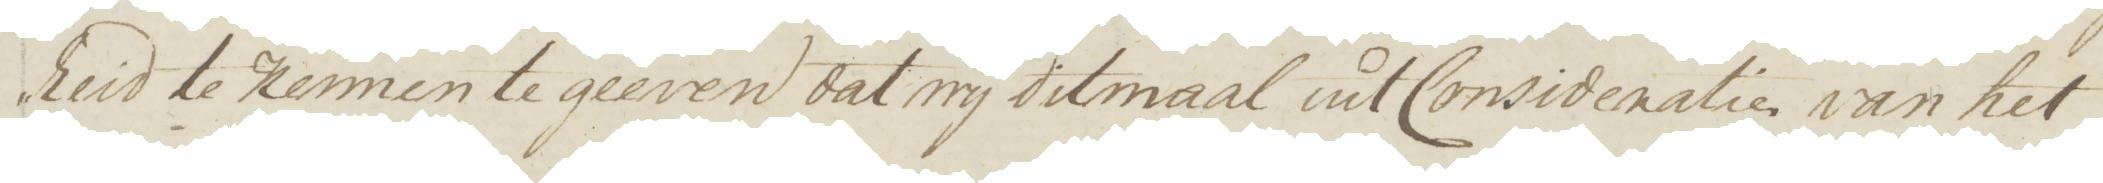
„heid te kennen te geeven dat wij ditmaal uit Consideratie van het
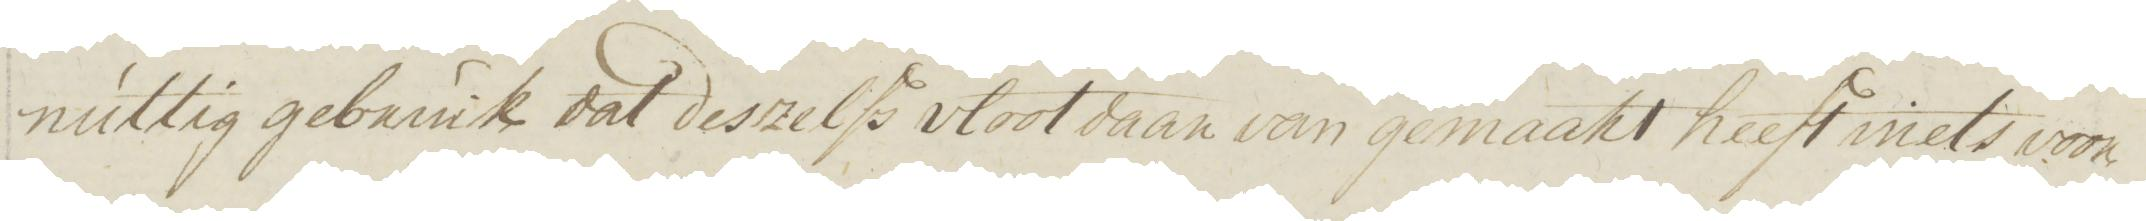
nuttig gebruik dat deszelfs vloot daar van gemaakt heeft niets voor
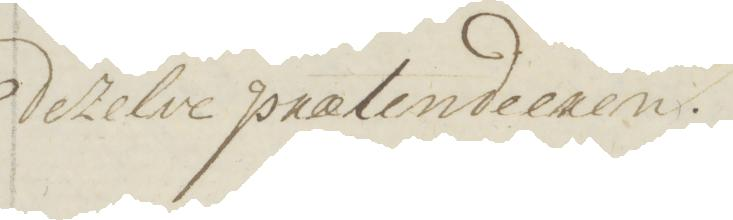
dezelve praetendeeren.
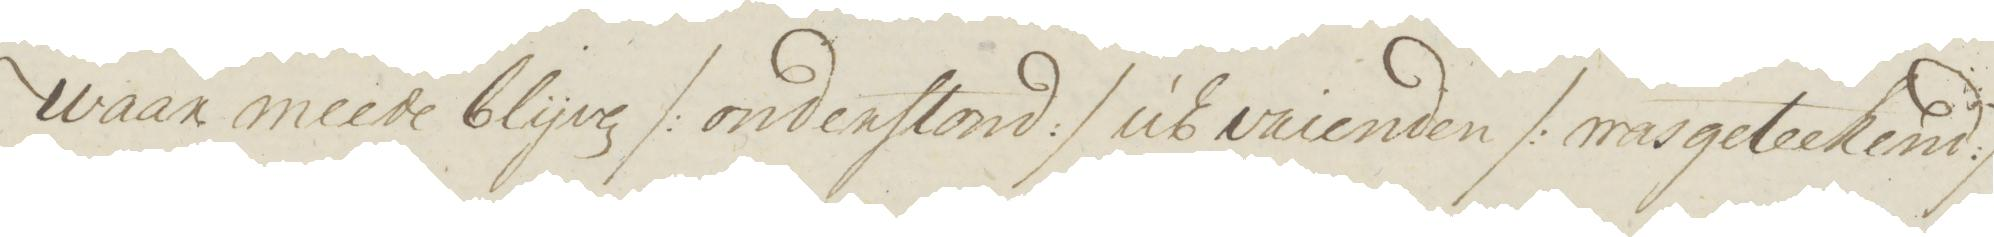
waar meede blijven /:onderstond:/ uE vrienden /:was geteekend:
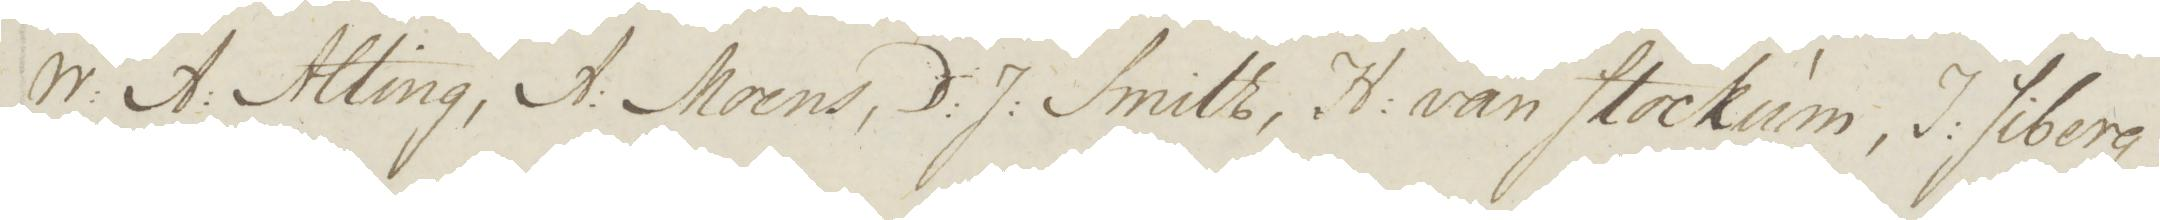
W: A: Alting, A: Moens, D: J. Smith, H: van Stockum, J: Siberg,
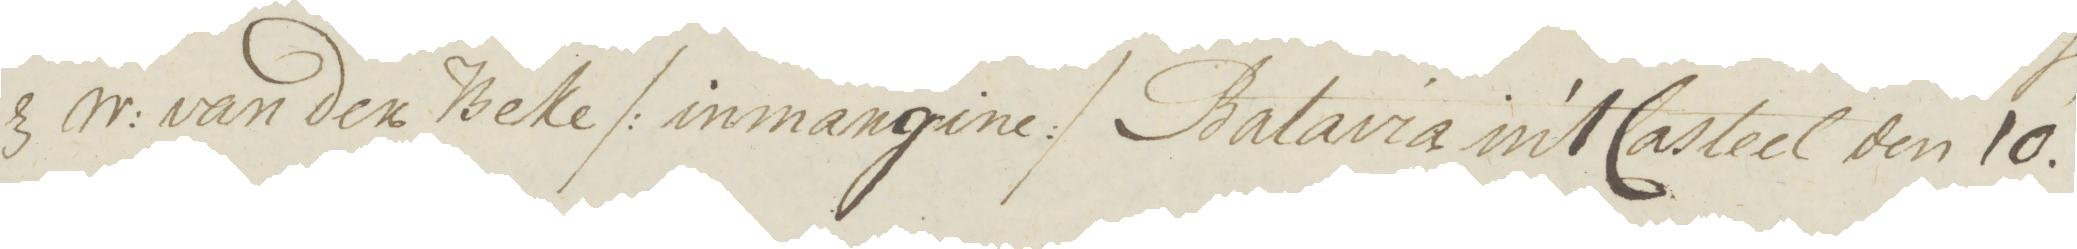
en W: van der Beke /:in margine:/ Batavia in’t Casteel den 10.
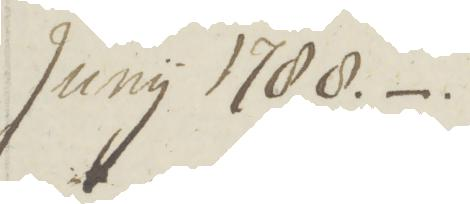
Junij 1788.-.
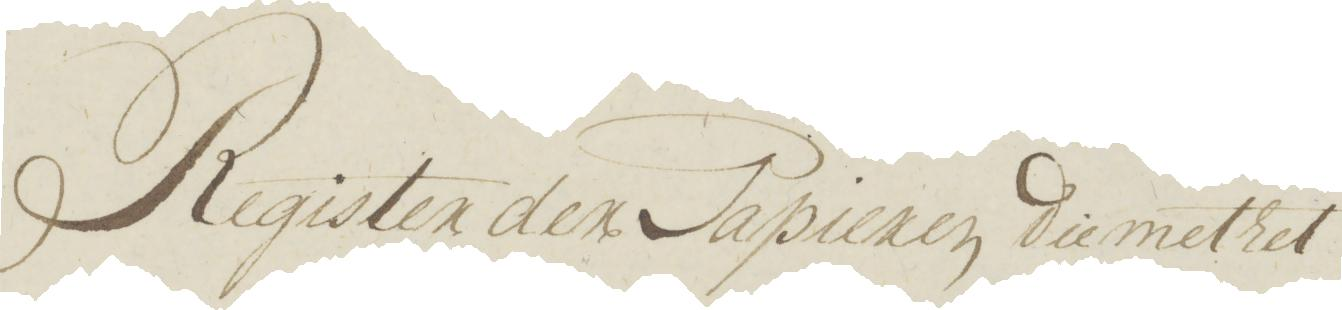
Register der Papieren die met het
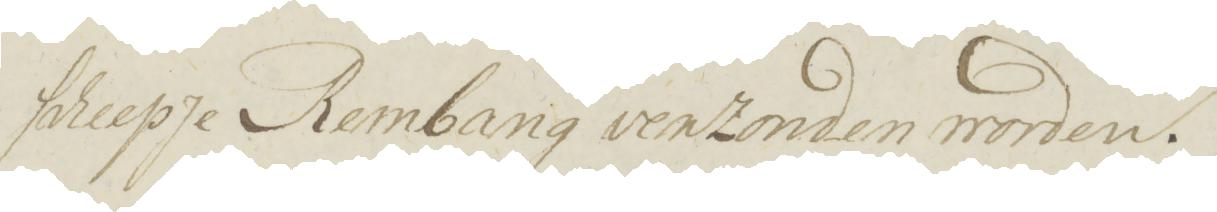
scheepje Rembang verzonden worden.
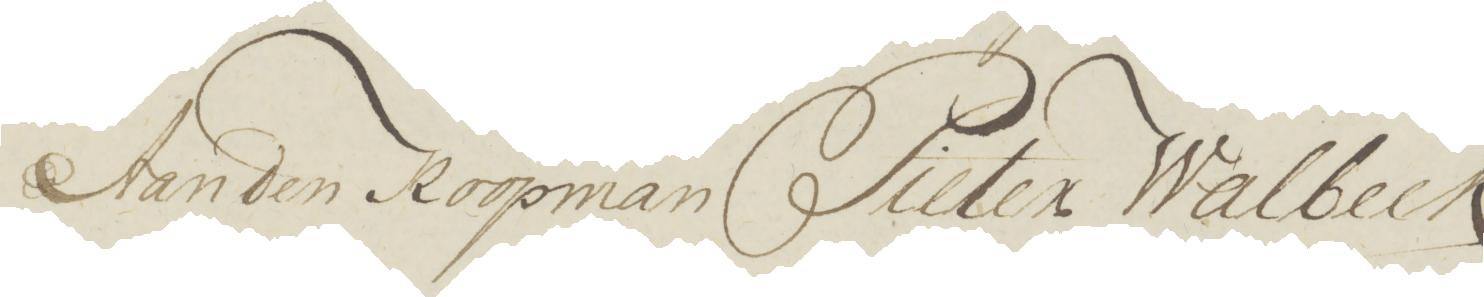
Aan den koopman Pieter Walbeek
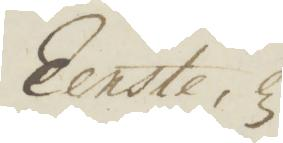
Eerste, en
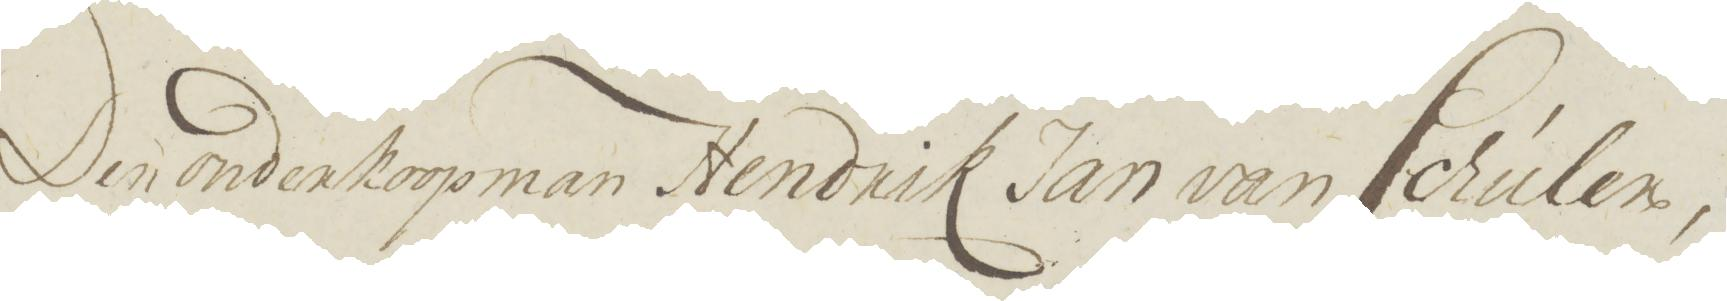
Den onderkoopman Hendrik Jan van Schuler,
